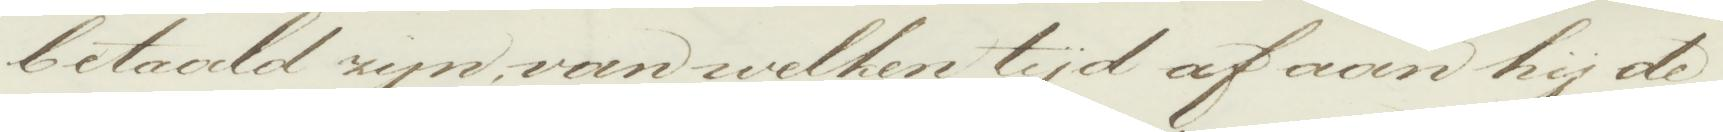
betaald zijn, van welken tijd af aan hij de
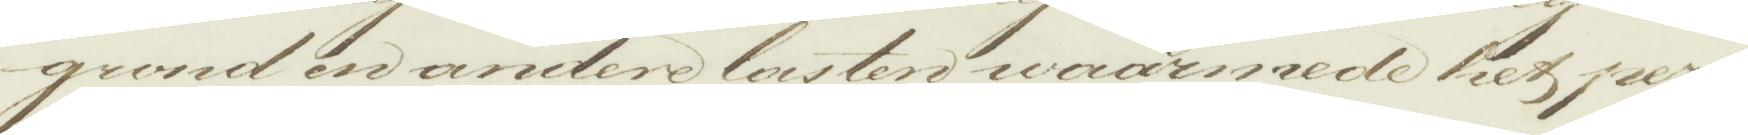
grond en andere lasten, waarmede het per
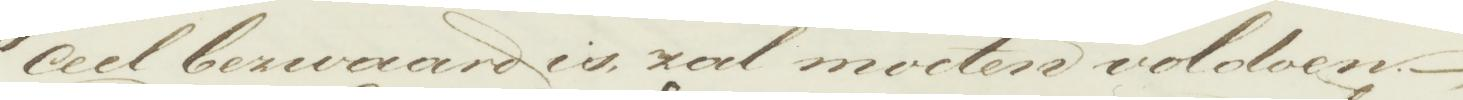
ceel bezwaard is, zal moeten voldoen.—
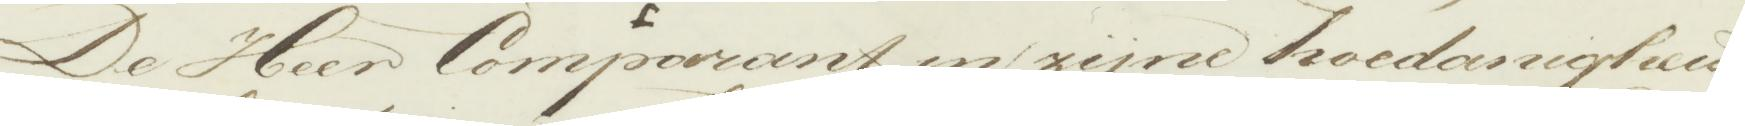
De Heer Comparant in zijne hoedanigheid
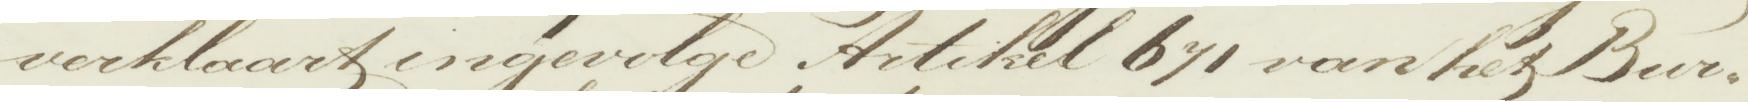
verklaart ingevolge Artikel 671 van het Bur„
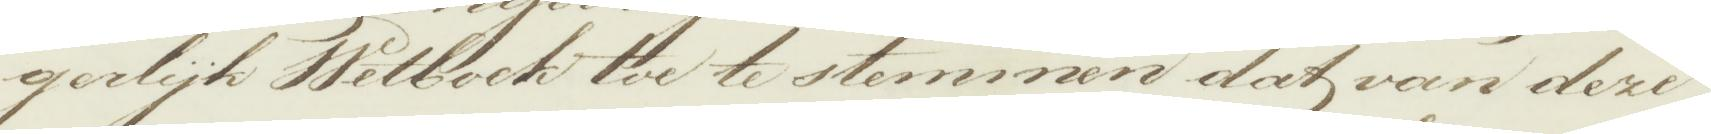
gerlijk Wetboek toe te stemmen dat van deze
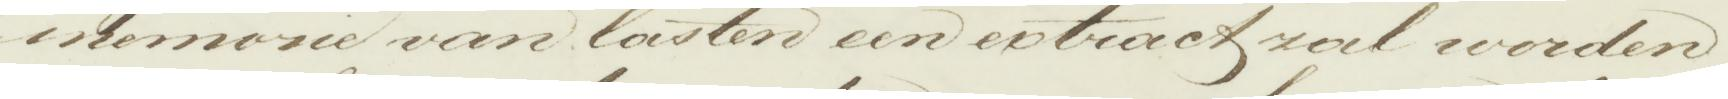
memorie van lasten een extract zal worden
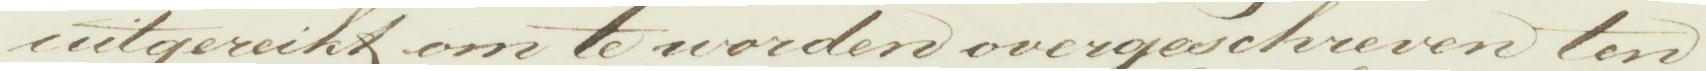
uitgereikt om te worden overgeschreven ten
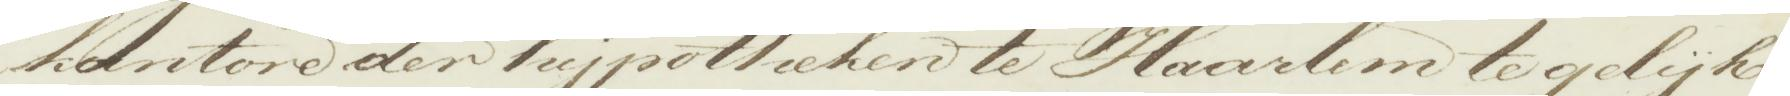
kantore der hijpotheken te Haarlem te gelijk
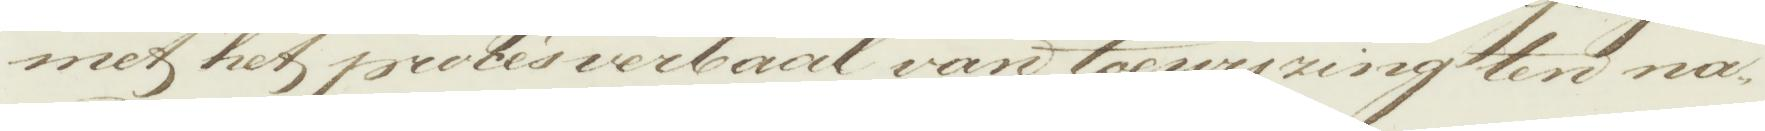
met het proces verbaal van toewijzing ten na„
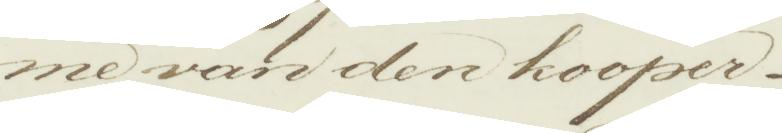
me van den kooper
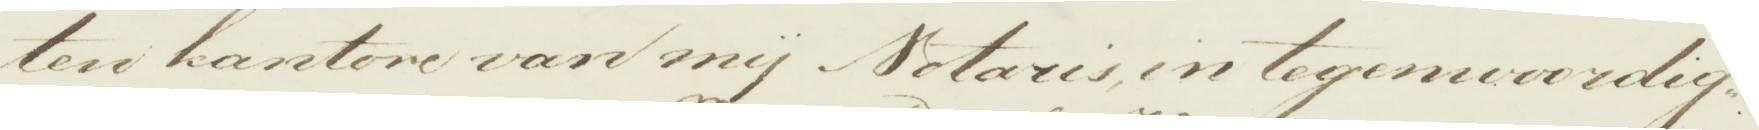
ten kantore van mij Notaris, in tegenwoordig„
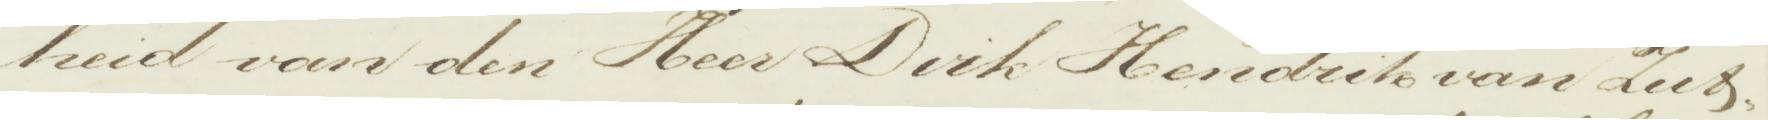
heid van den Heer Dirk Hendrik van Zut„
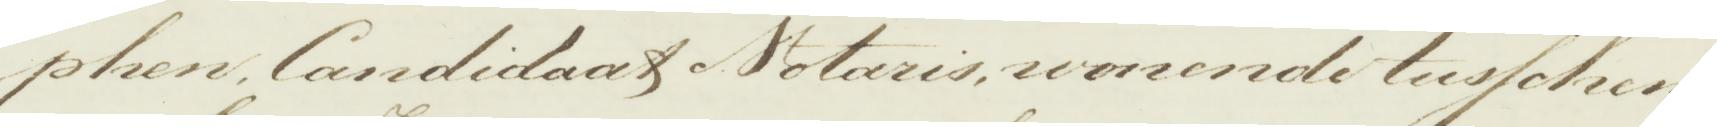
phen, Candidaat Notaris, wonende tusschen
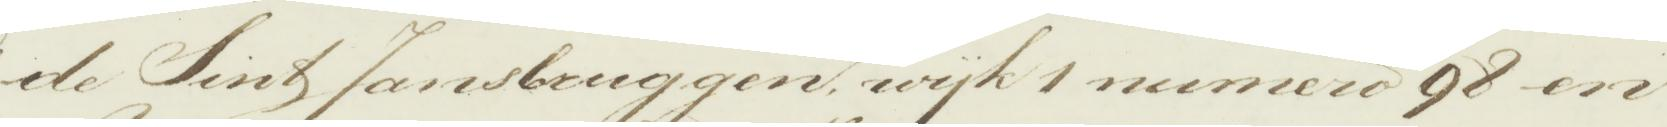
de Sint Jansbruggen, wijk 1 numero 98 en
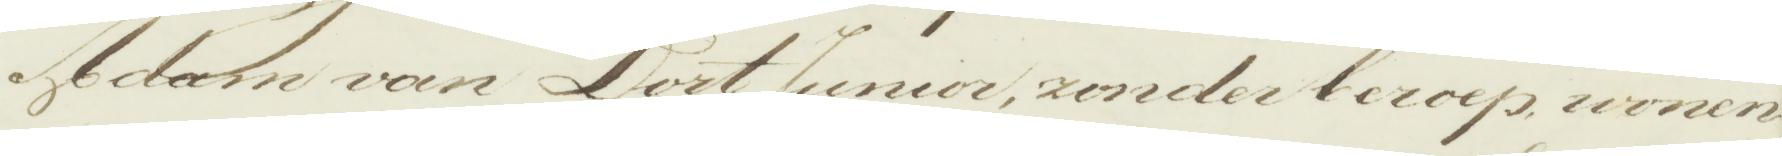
Adam van Dort Junior, zonder beroep, wonen
